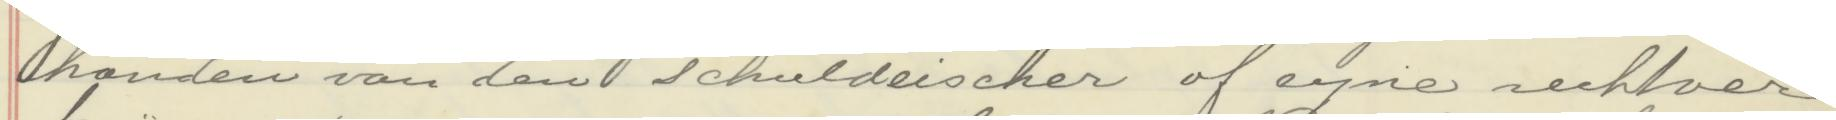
handen van den schuldeischer of zyne rechtver
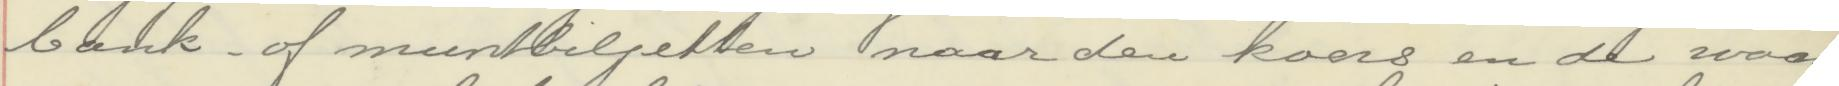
bank - of muntbiljetten naar den koers en de waar
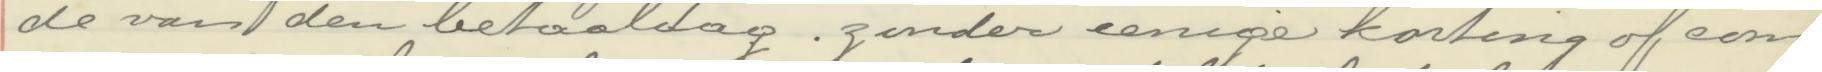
de van den betaaldag. zonder eenige korting of com
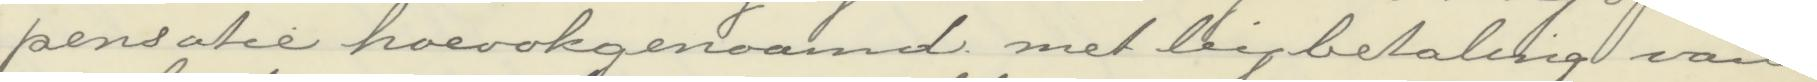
pensatie hoe ook genaamd met bijbetaling van
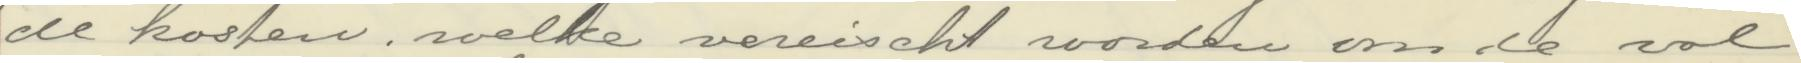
de kosten, welke vereischt worden om de vol
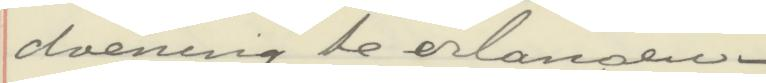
doening te erlangen
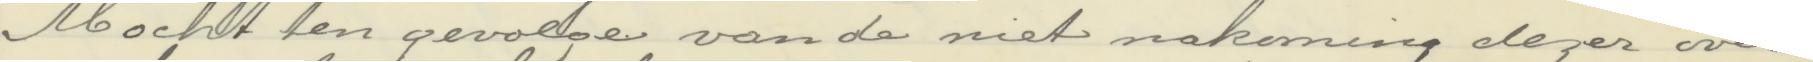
Mocht ten gevolge van de niet nakoming dezer over
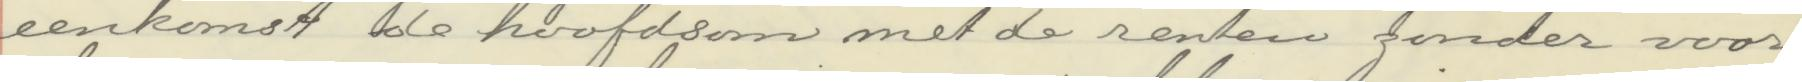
eenkomst de hoofdsom met de renten zonder voor
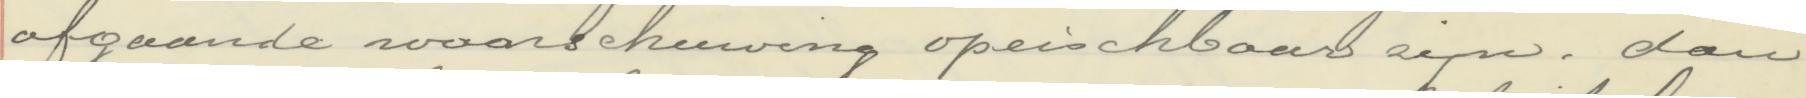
afgaande waarschuwing opeischbaar zijn, dan
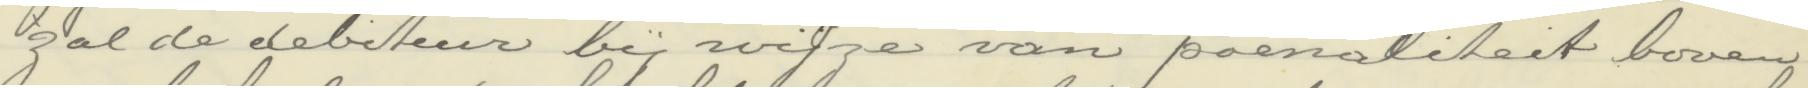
zal de debiteur bij wijze van poenaliteit boven
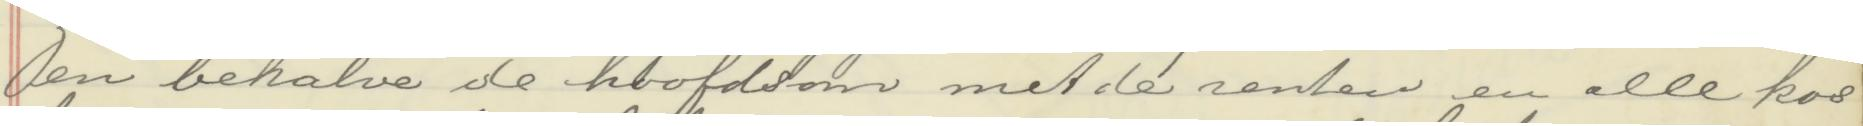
en behalve de hoofdsom met de renten en alle kos
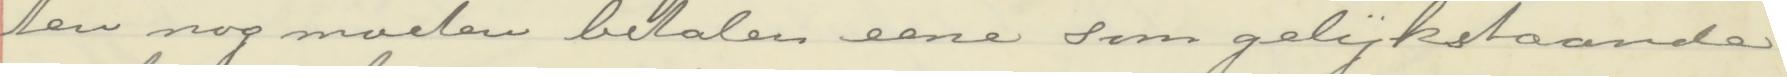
ten nog moeten betalen eene som gelijkstaande
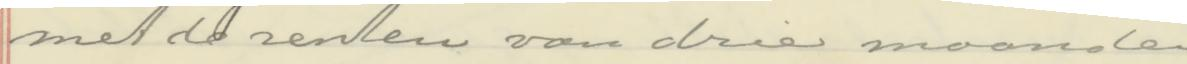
met de renten van drie maanden
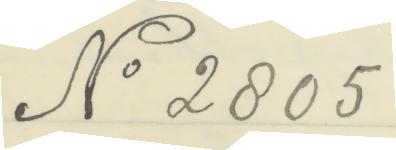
No 2805
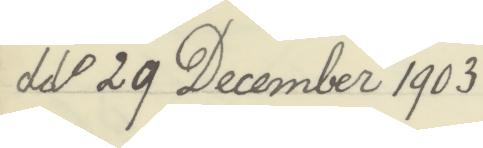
ddo 29 December 1903
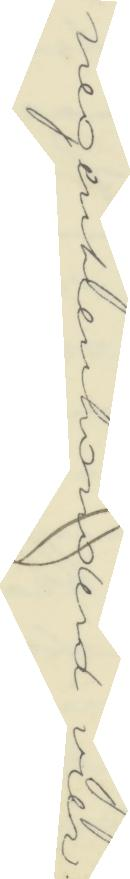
negentienhonderd vier
